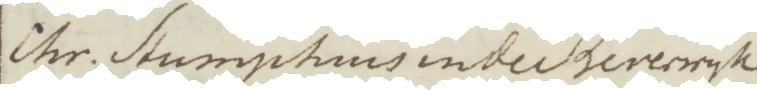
Chr. Stumphius in de Beverwyk
